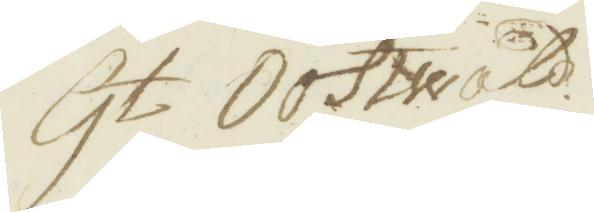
Gt Oostwald.
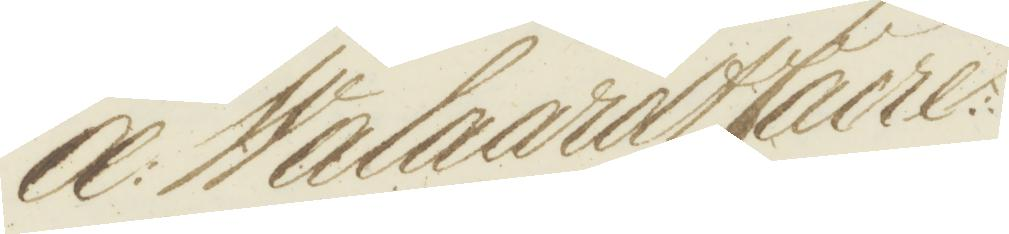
ae: Walaardt Sacre:
